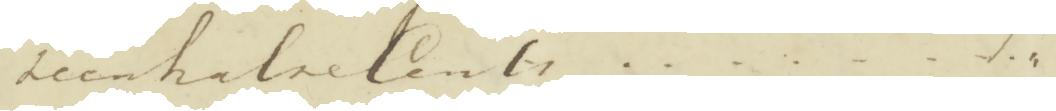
& een halve Cents. . . . . . „
